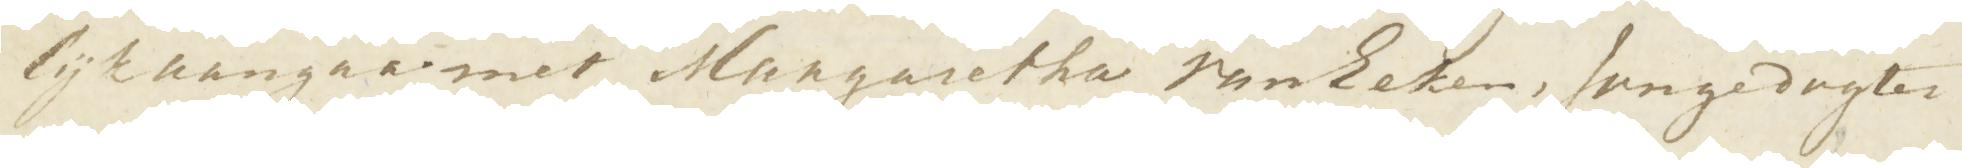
lijk aangaa met Margaretha van Eeken, Jongedogter
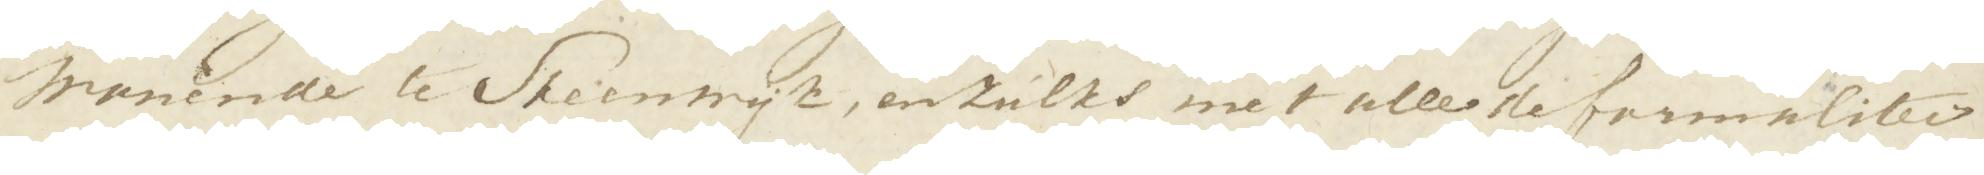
wonende te Steenwijk, en zulks met alle de formalitei
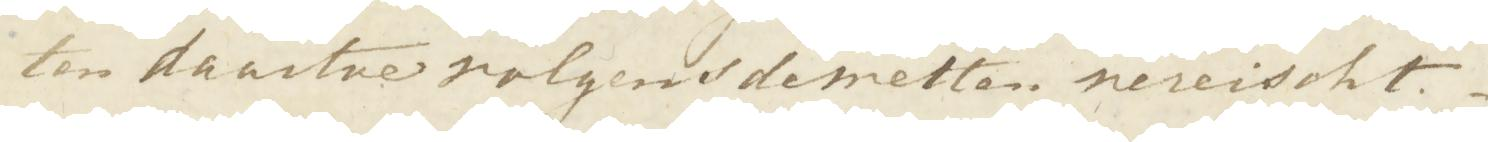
ten daartoe volgens de wetten vereist.
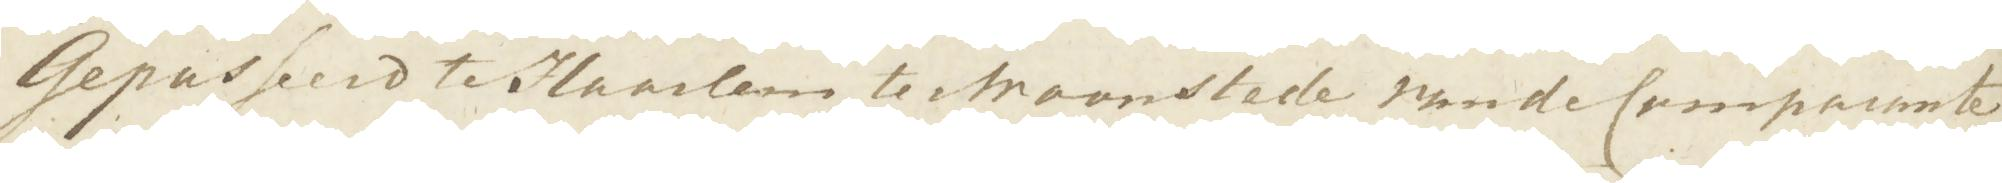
Gepasseerd te Haarlem ter woonstede van de Comparante
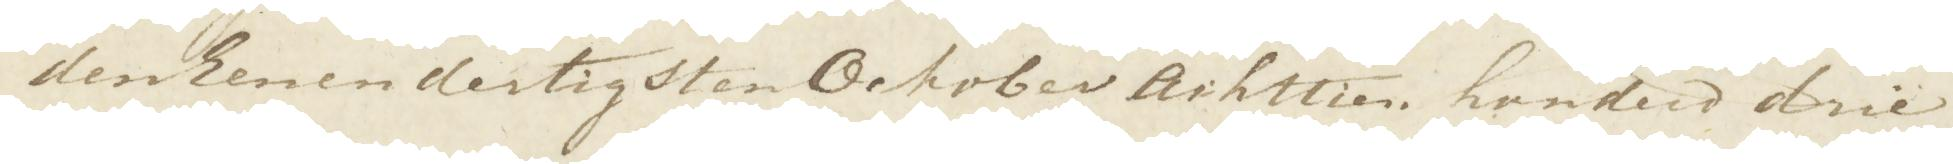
den Een en dertigsten October Achttien honderd drie
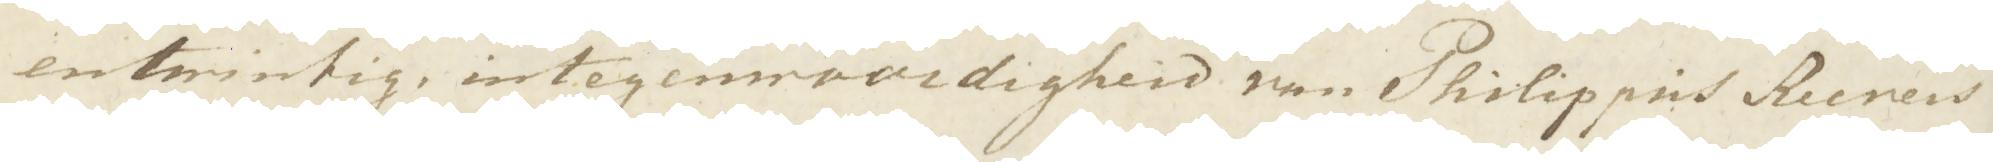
en twintig, integenwoordigheid van Philippus Reevers
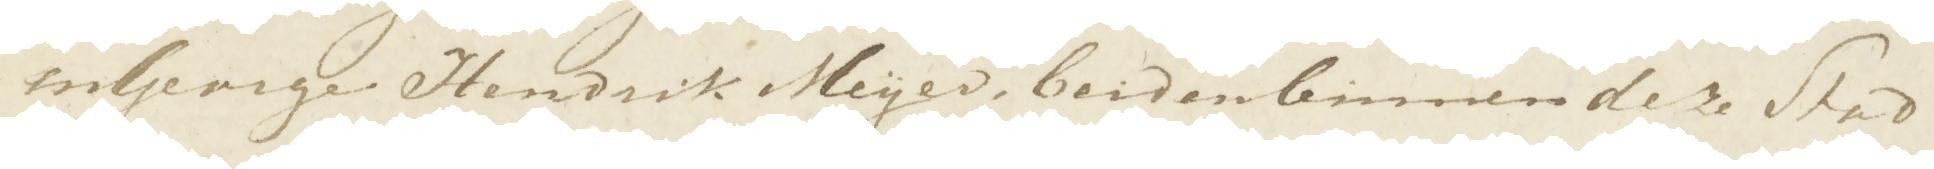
en George Hendrik Meijer, beiden binnen deze Stad
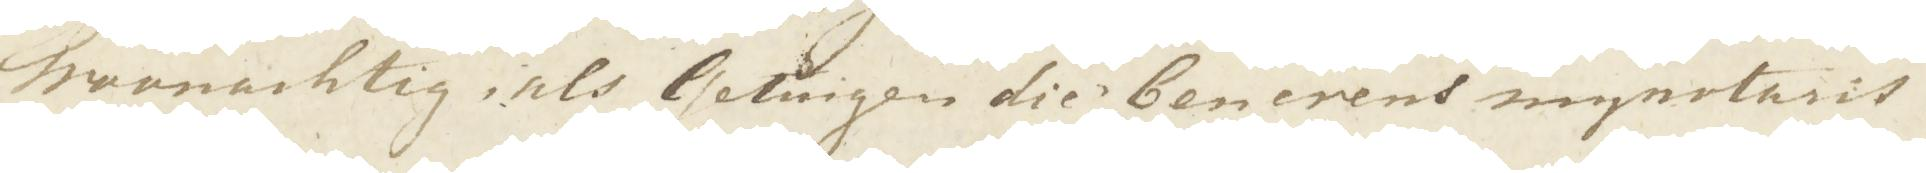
woonachtig, als Getuigen die benevens my notaris
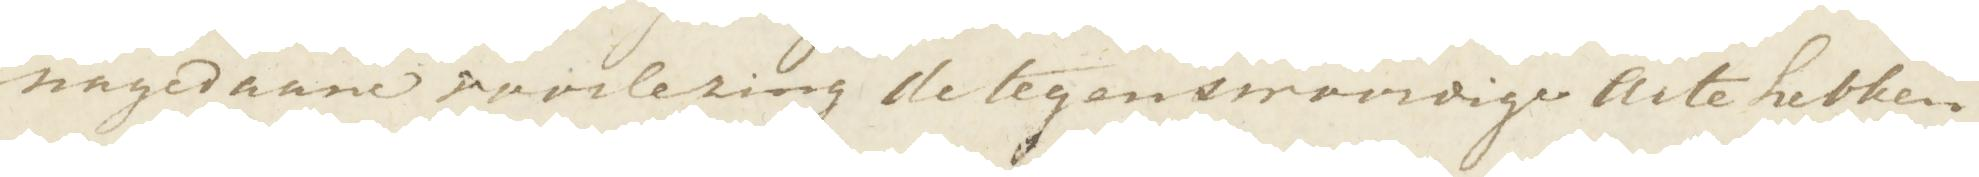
nagedaane voorlezing de tegenswoordige Acte hebben
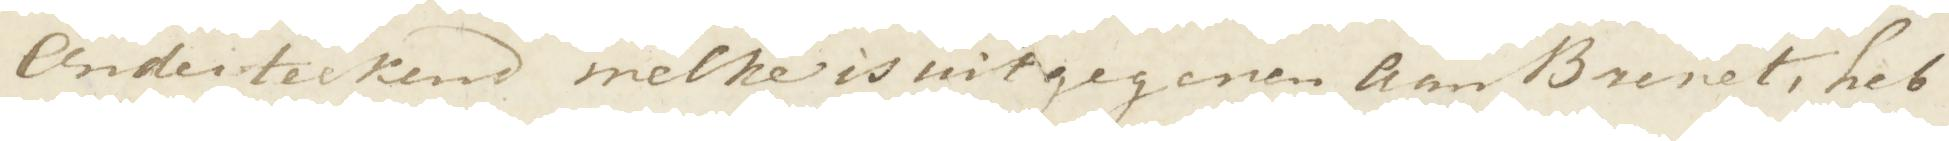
Onderteekend, welke is uitgegeven aan Brevet, het
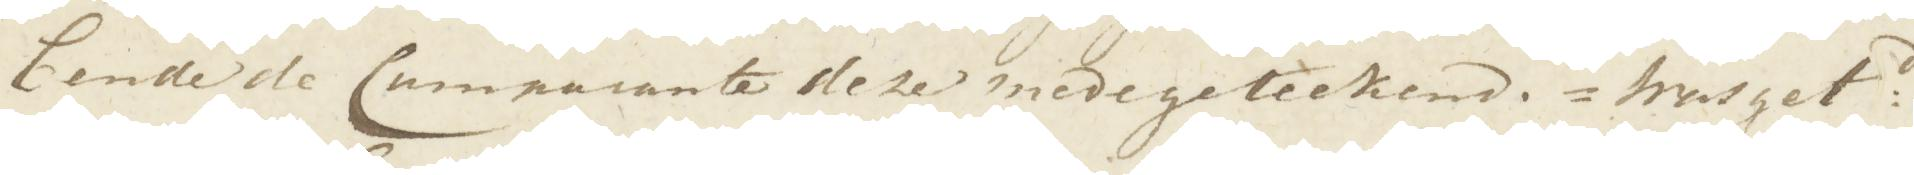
Eende de Comparante deze medegeteekend. = was get:
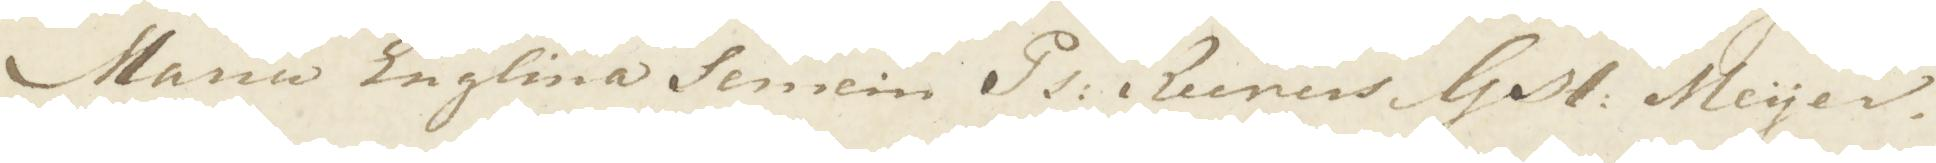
Maria Englina Semein Ps: Reevers GH: Meijer,
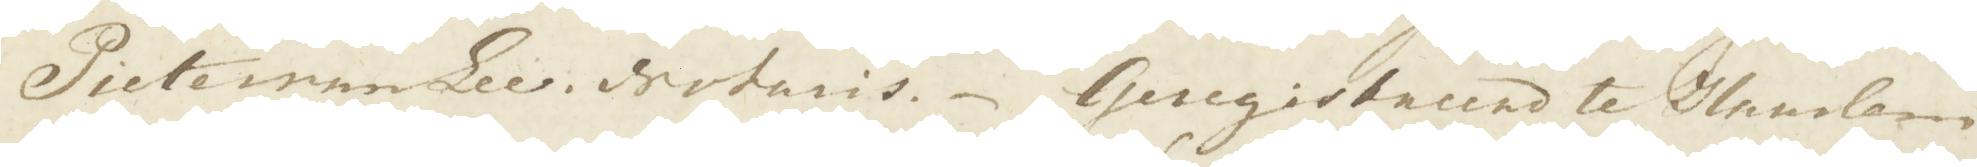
Pieter van Lee, Notaris. – Geregistreerd te Haarlem
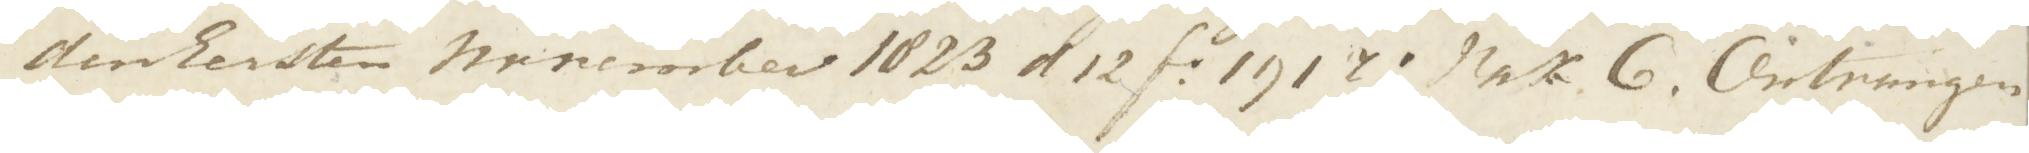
den Eersten November 1823 d12 f: 191 r: Vak 6, Ontvangen
